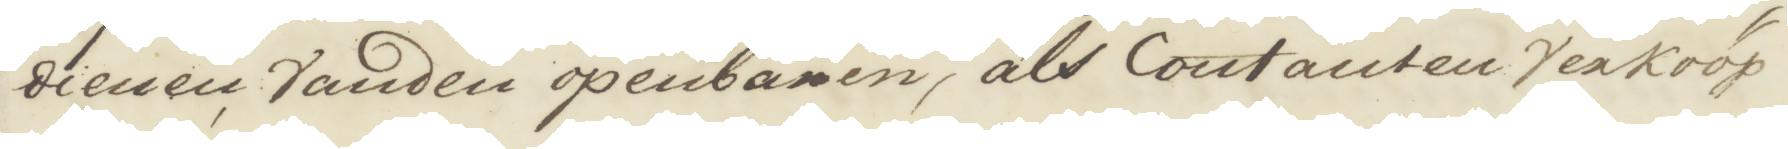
dienen vanden openbaren, als contanten verkoop
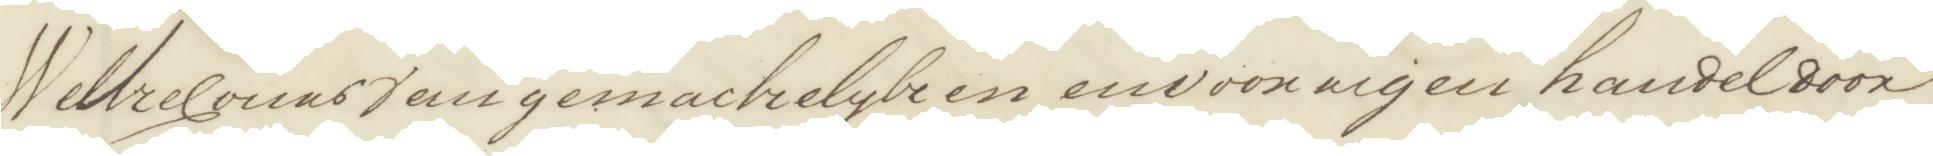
Welke cours van gemackelyken en voorrigen handel door
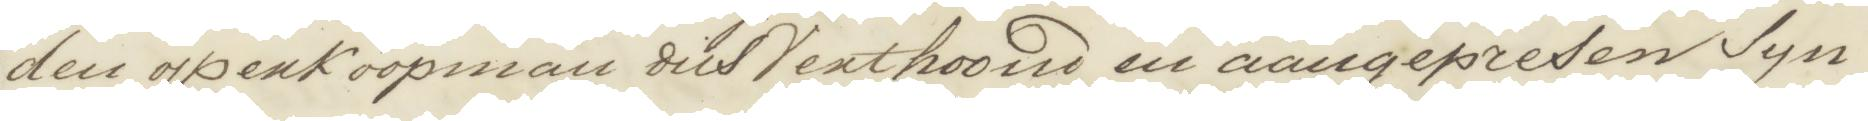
den opperkoopman dus verthoond en aangepresen syn
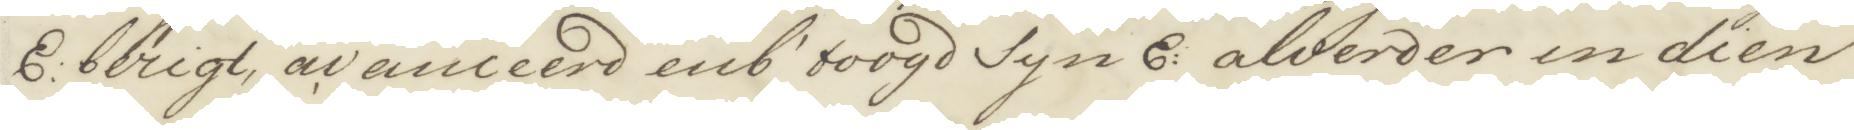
E: berigt, avanceerd en b'toogd syn E: alverder in dien
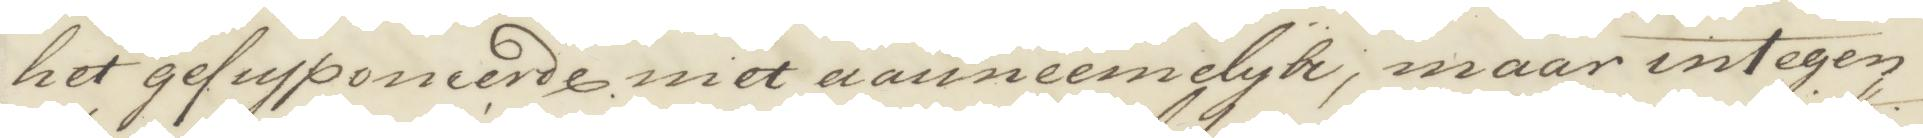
het gesupponeerde niet aanneemelijk, maar integen
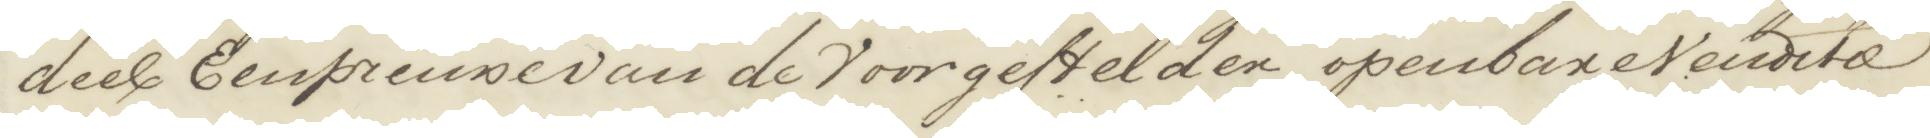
deel Een preuve van de voorgestelden openbare venditie
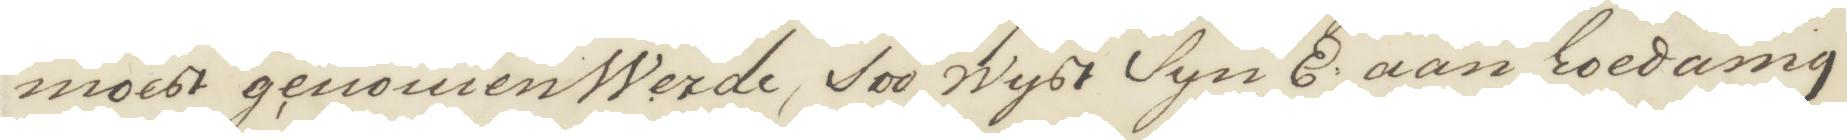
moest genomen Werde, soo wijst syn E: aan hoedanig
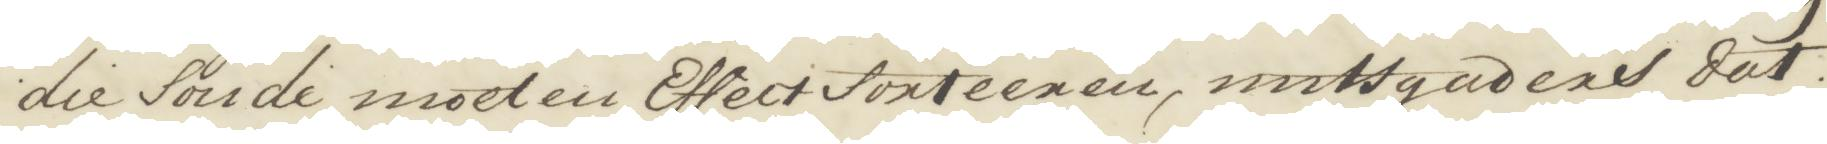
die soude moeten Effect sorteeren, mitsgaders dat
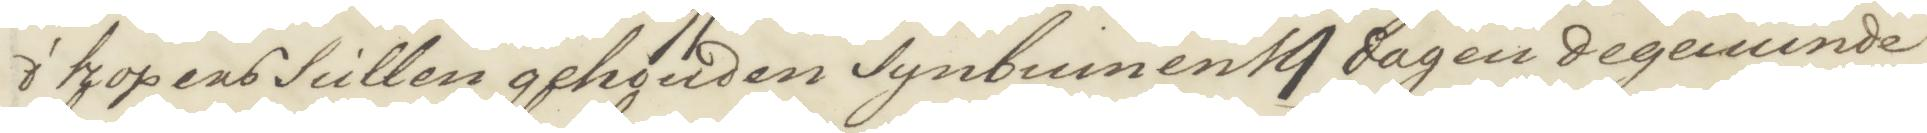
d' kopers sullen gehouden syn binnen 14 dagen de geminde
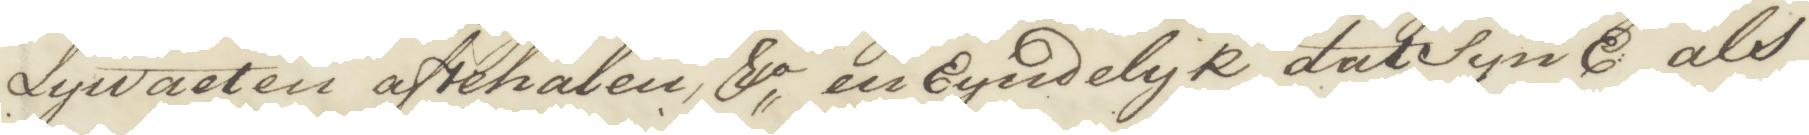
Lywaeten aftehalen, &„a en Eyndelyk dat syn E: als
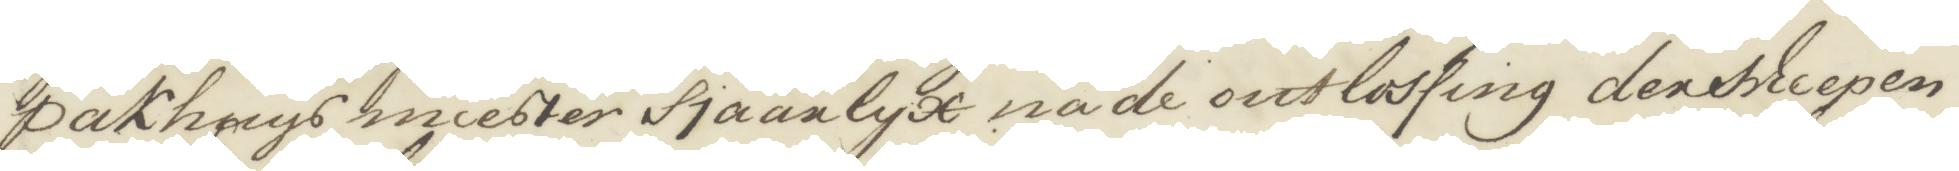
pakhuijs meester 'sjaarlyx na de ontlossing der scheepen
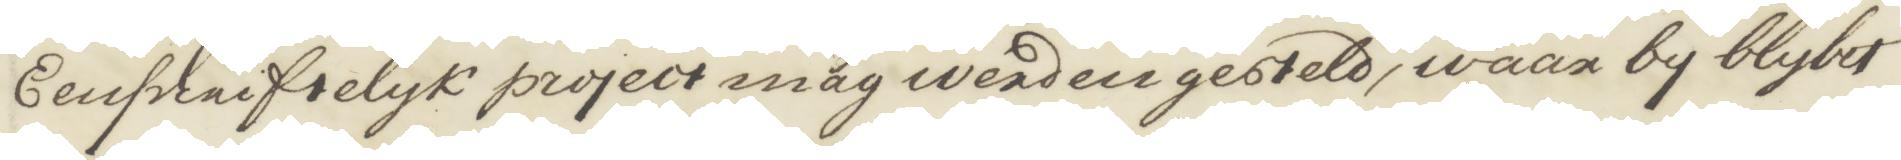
Een schriftelyk project mag werden gesteld, waar bij blykt
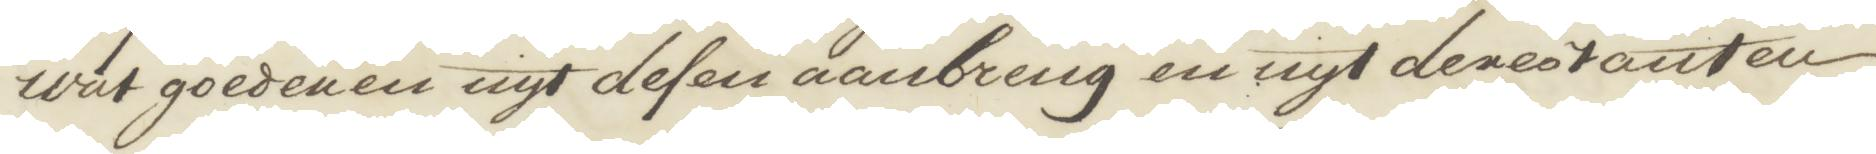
wat goederen uyt desen aanbreng en uyt derestanten
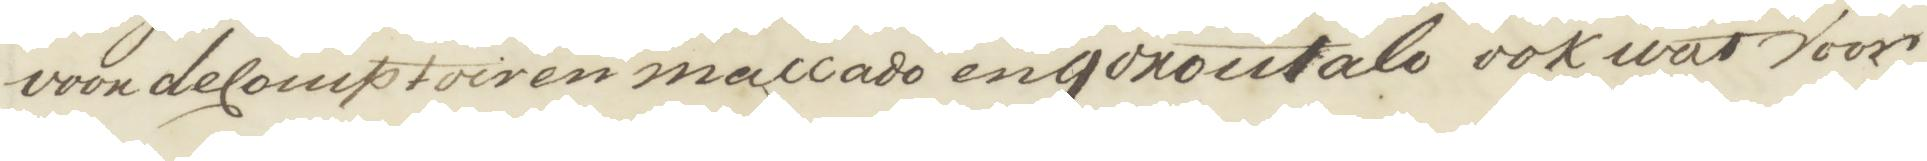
voor de Comptoiren maccado en goroutalo ook wat voor
